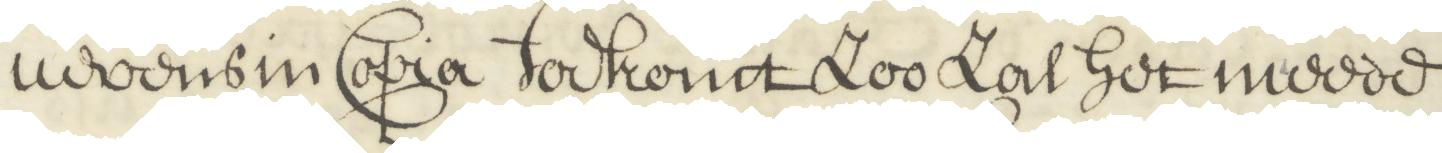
nevens in Copia toekomt zoo zal het meede
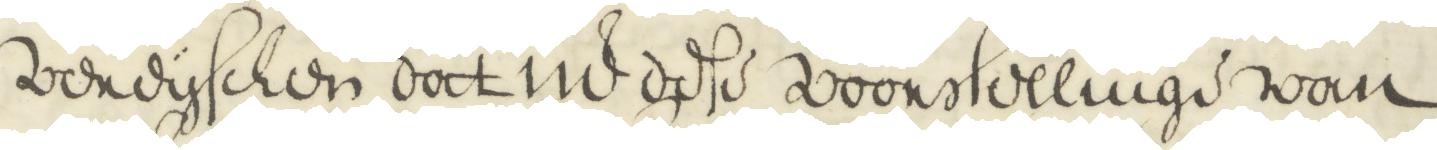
vereijschen dat uE dese voorstellinge van
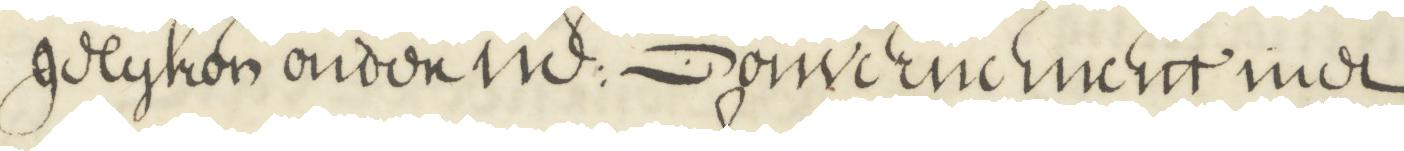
gelijken onder uE: Gouvernement met
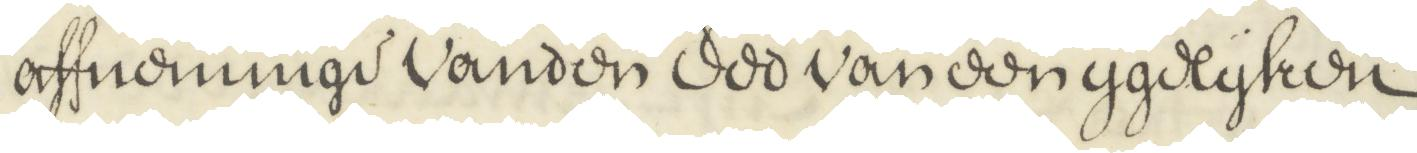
affneminge vanden Eed van een ijgelijken
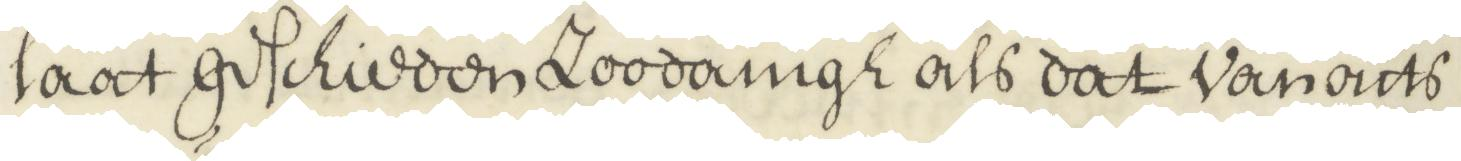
laat geschieden zoodanigh als dat van outs
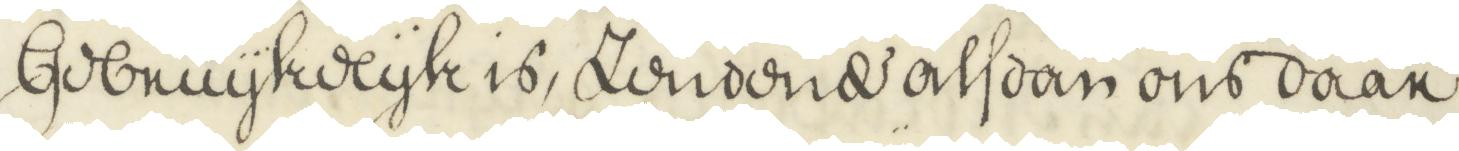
Gebruijkelijk is, zendende alsdan ons daar
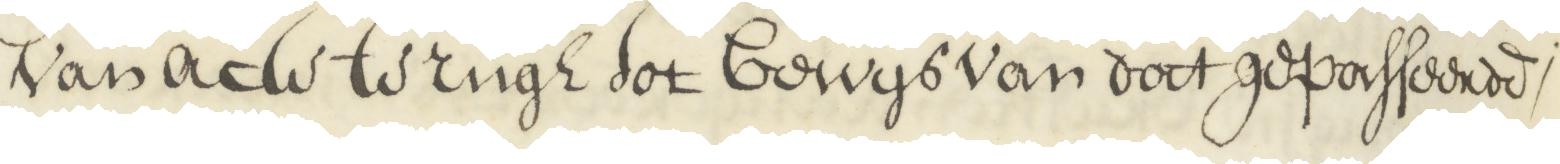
van acte terugh tot bewijs van dat gepasseerde/
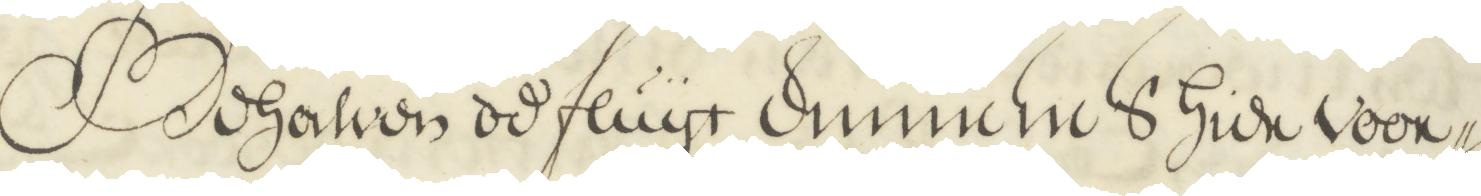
Behalven de fluijt Emmenes hier voor„
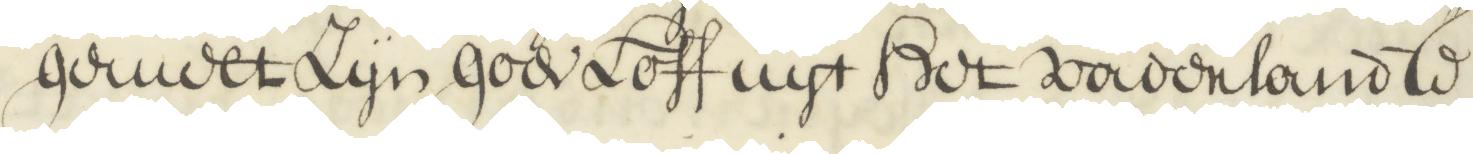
gemelt zijn gode Loff uijt het vaderland te
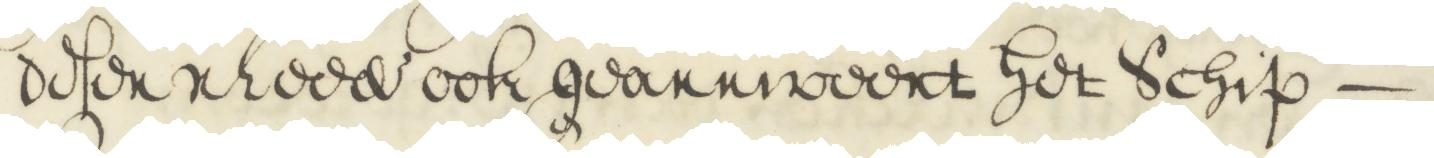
deser rheede ook gearriveert het schip —
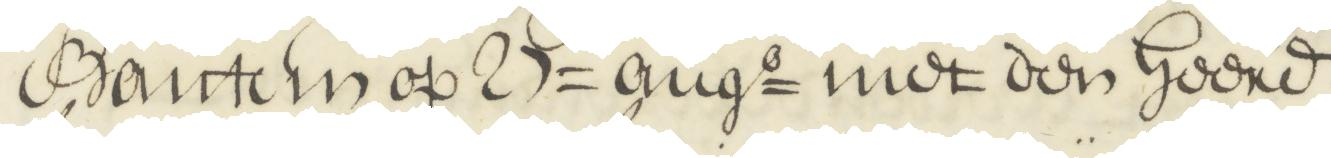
Bantem op 21=en aug=o met den heere
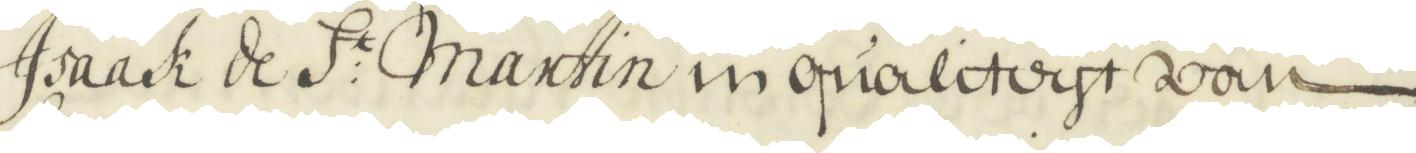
Isaak de S:t Martin in qualiteijt van
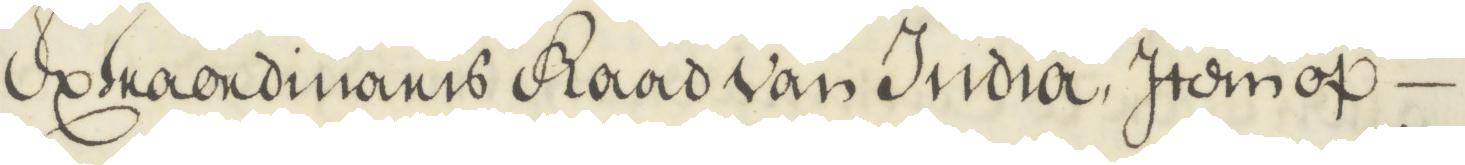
Extraordinaris Raad van India, Item op —
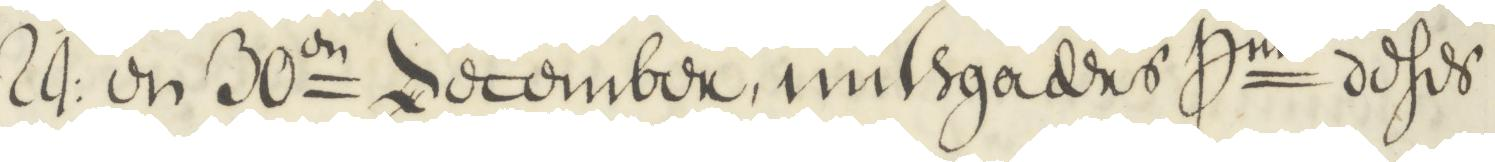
24: en 30=en December, mitsgaders p=mo deses
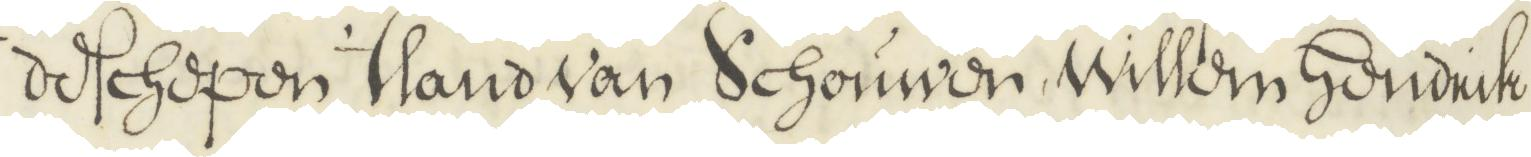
deschepen 'tland van schouwen, Willem hendrik
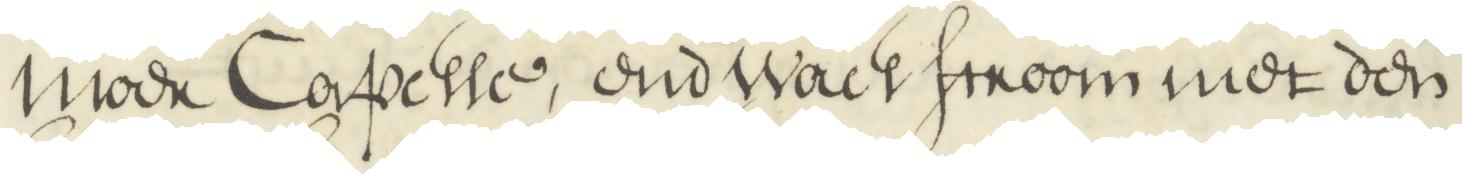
moer Capelle, end wael stroom met den
